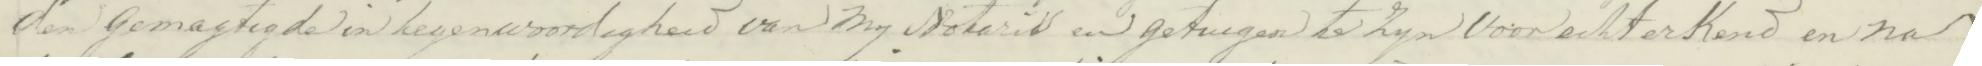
den gemagtigde in tegenwoordigheid van my Notaris en getuigen te zijn voor echt erkend en na
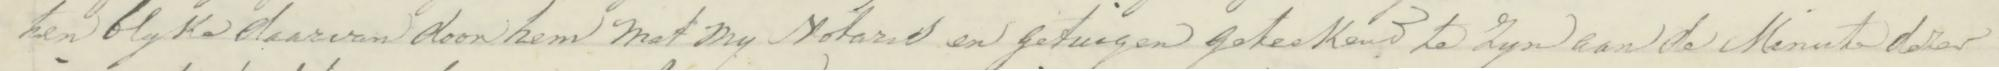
ten blyke daarvan door hem met my Notaris en getuigen geteekend te zyn aan de Minute dezer
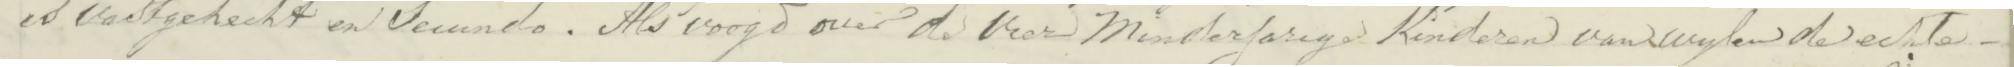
is vastgehecht en Secundo. Als voogd over de vier minderjarige kinderen van wylen de echte-
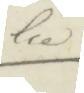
lie
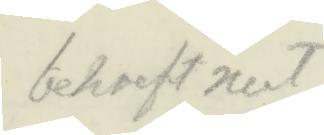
behoeft niet
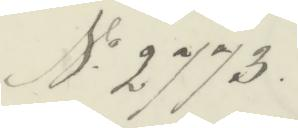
N:o 2773.
